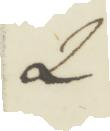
„ 2 =
